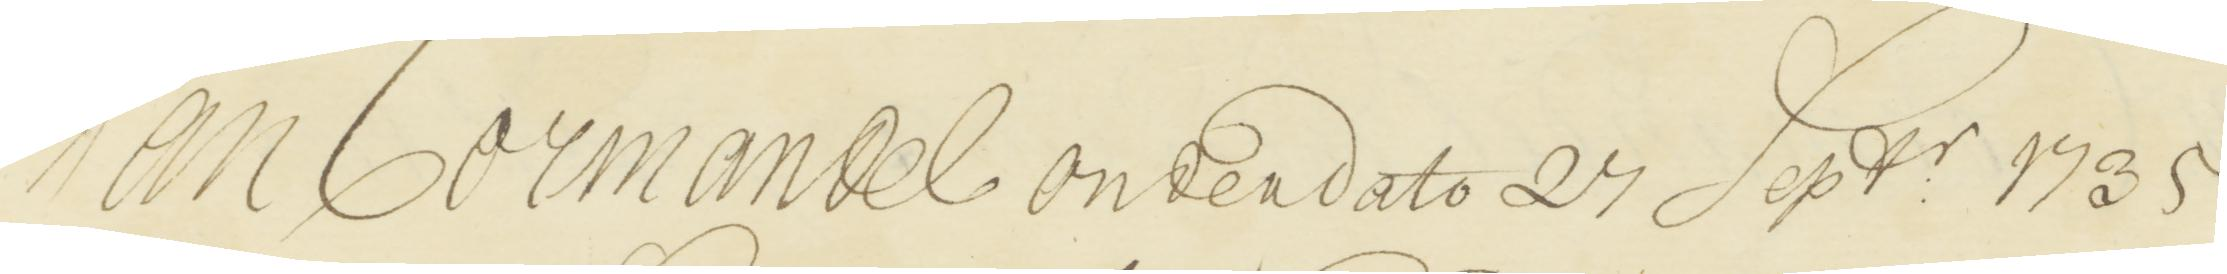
Van Cormandel onder dato 27 Sept:r 1735
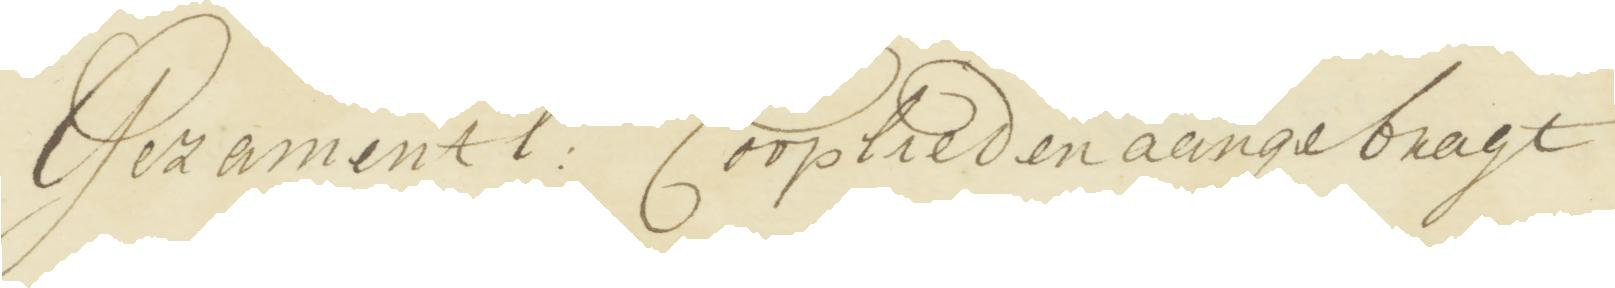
Gezamentl:ke Cooplieden aangebragt
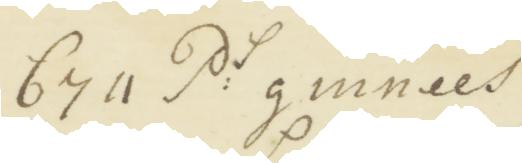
6711 P:s ginnees
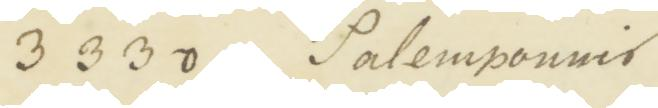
3330 „ Salempouris
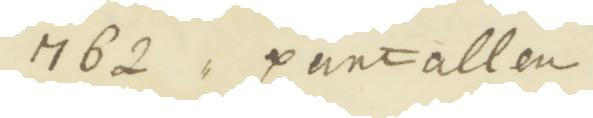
762 „ parcallen
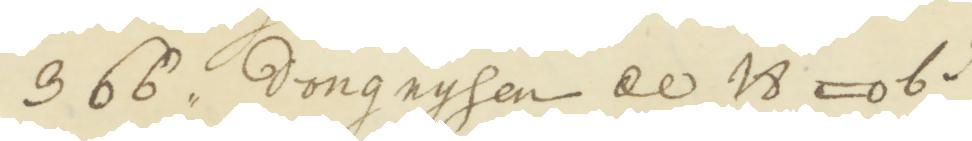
366 „ dongrysen de 18 cob:s
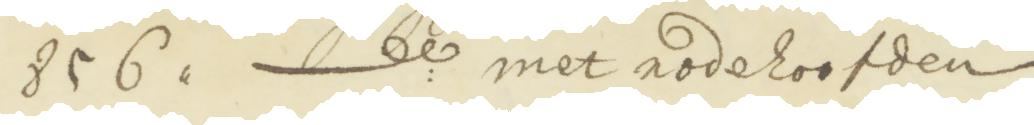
856 „ —:o met rode hoofden
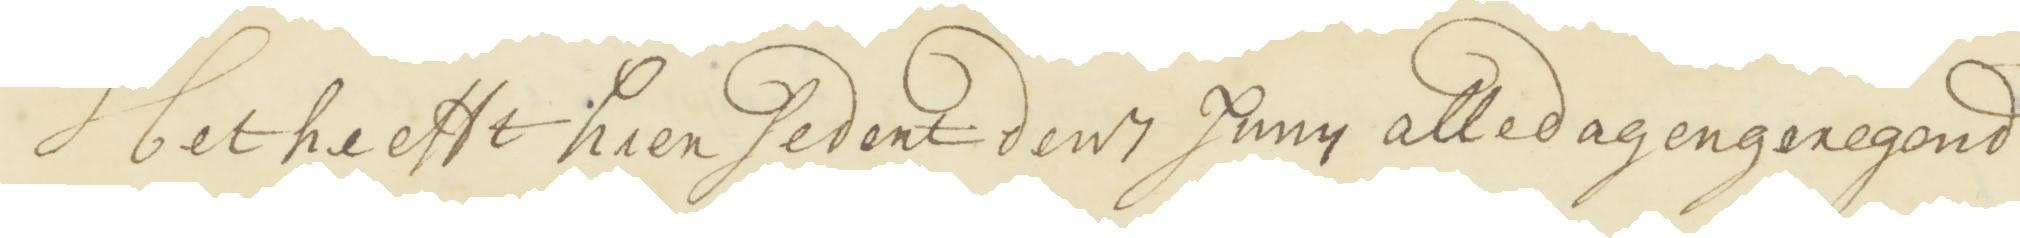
Het heefft hier sedert den 7 Juny alle dagen geregend
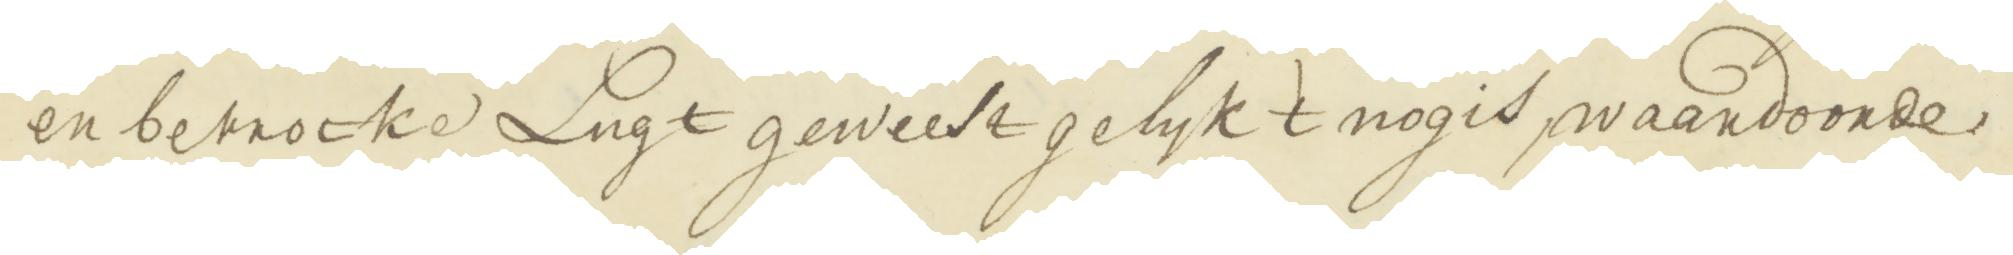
en betrocke Lugt geweest gelyk 't nog is, waar door de
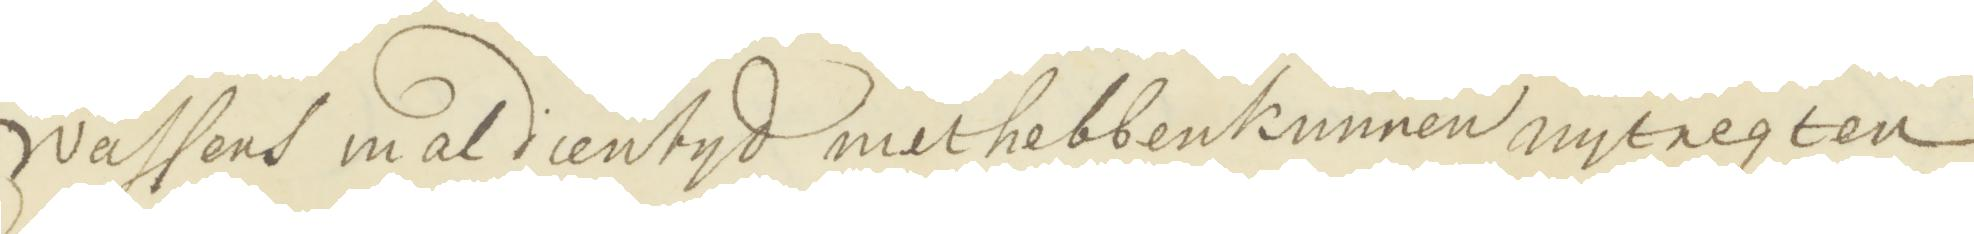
wassers in al dien tyd niet hebben kunnen uytregten
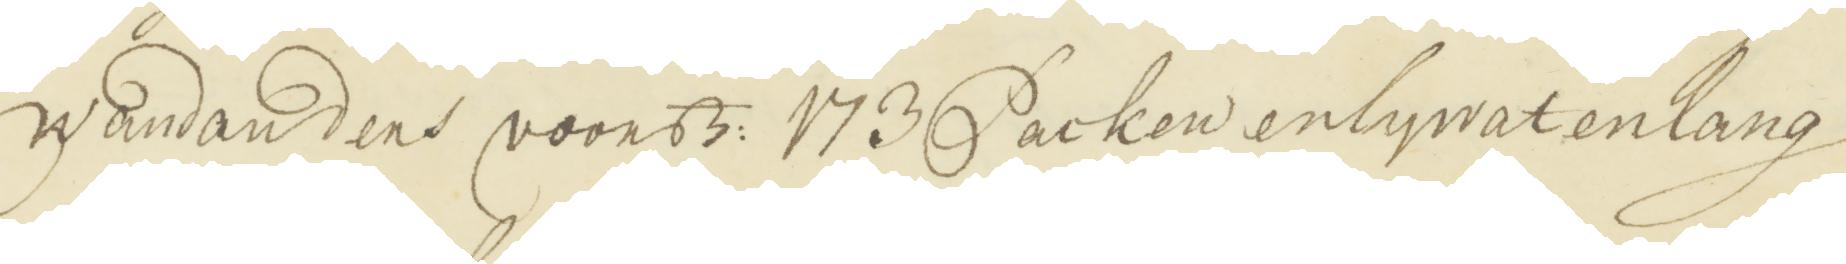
wand anders voorsz: 173 Packen en lywaten lang
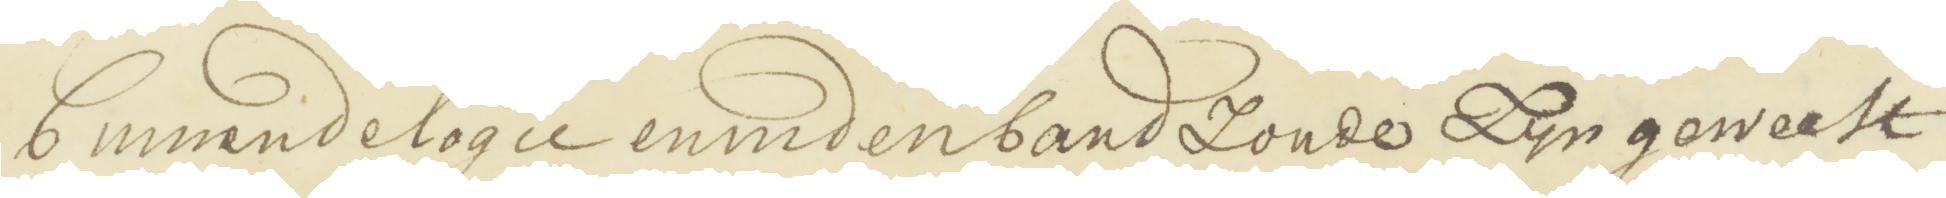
binnen de logie en inden band Zoude Zyn geweest
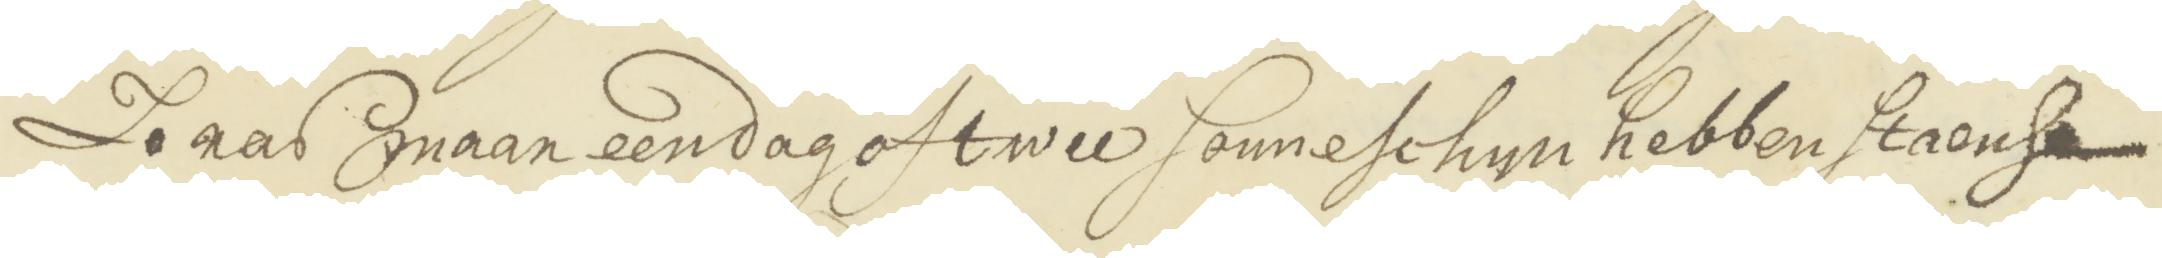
Zo ras maar een dag of twee Sonneschyn hebben Staen se
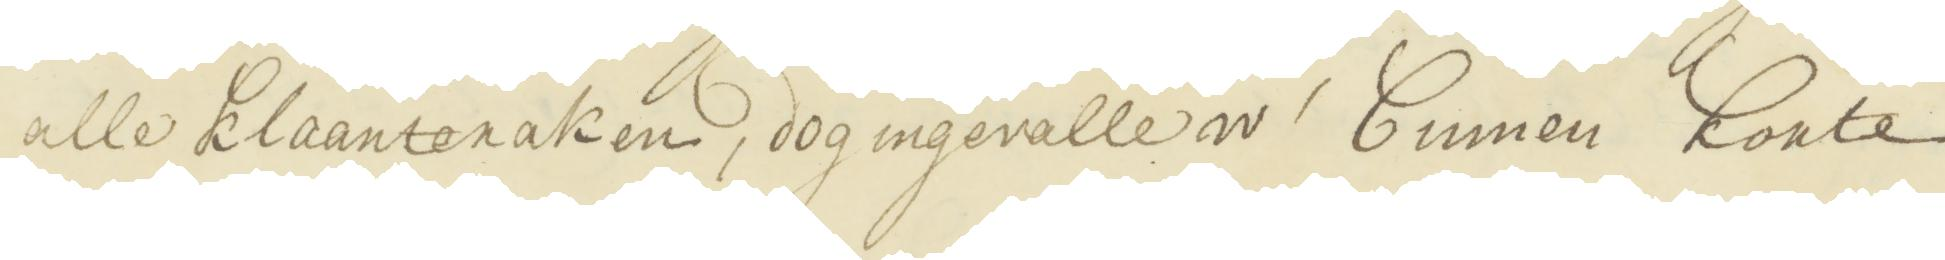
alle klaar te raken, dog ingevalle w' binnen korte
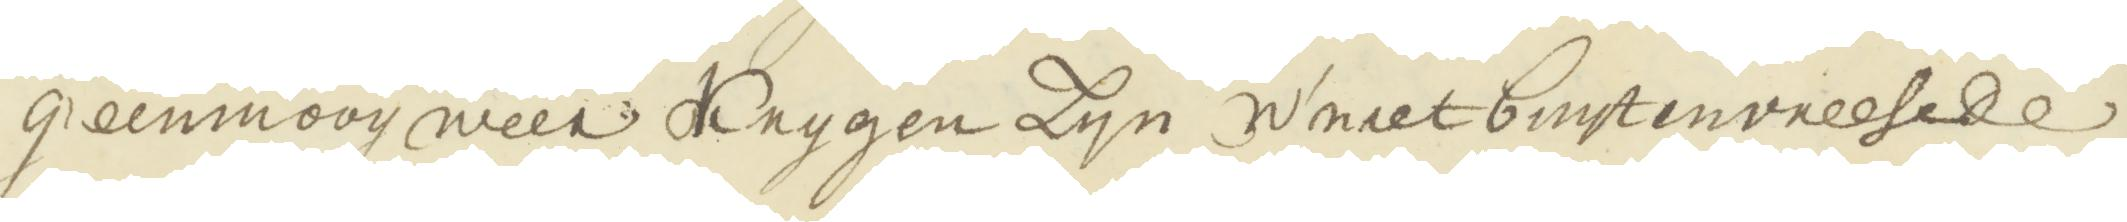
geen mooy weer Krygen Zyn w' niet buyten vreese de
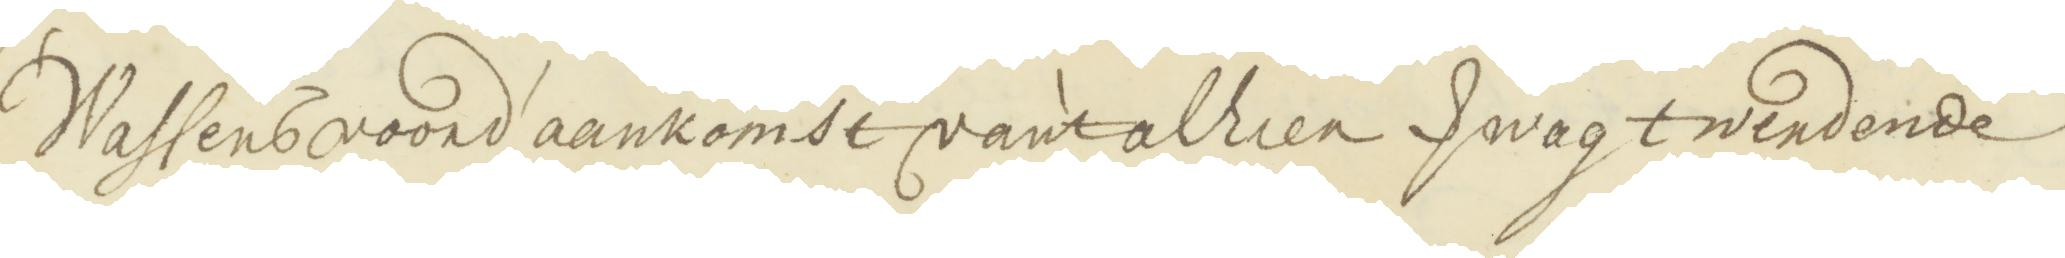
Wassers voor d’ aankomst van't alhier verwagt werdende
